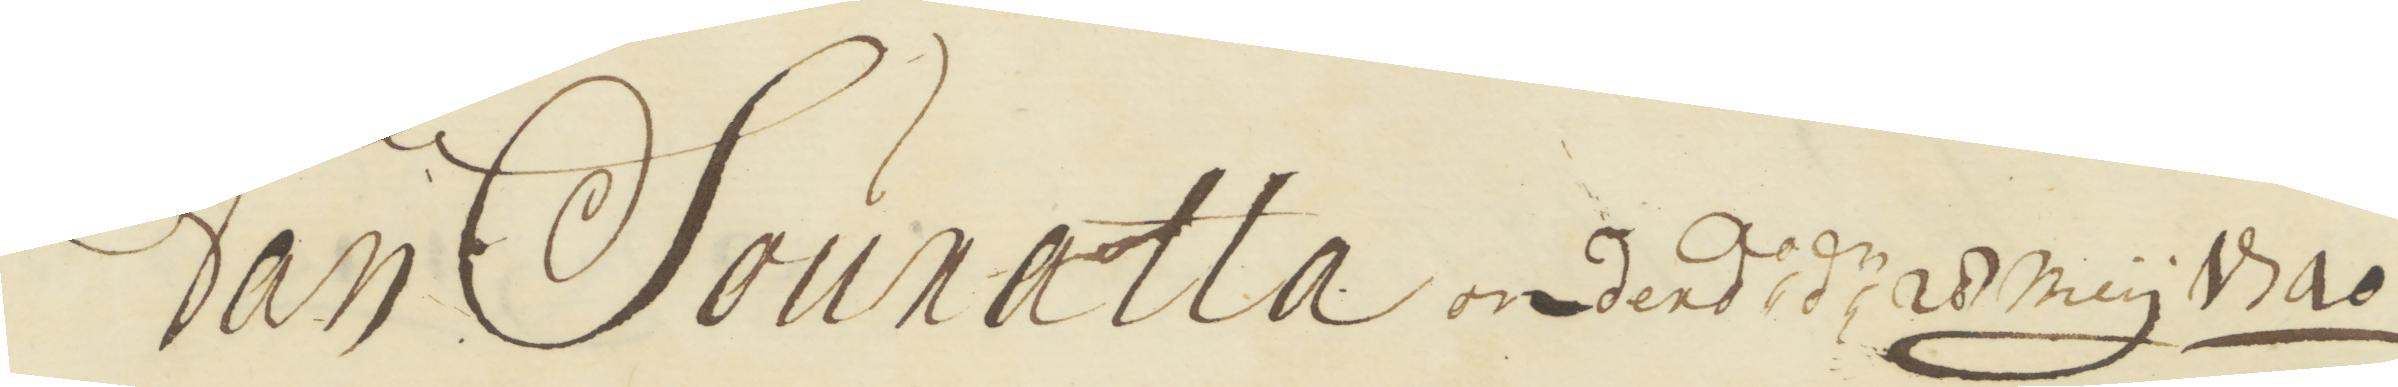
Van Souratta onderd„o d„n 28 Meij 1740
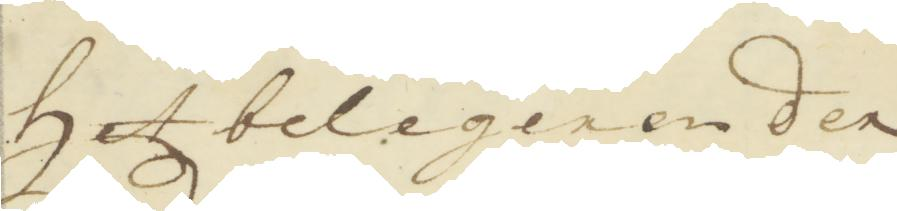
het belegeren der
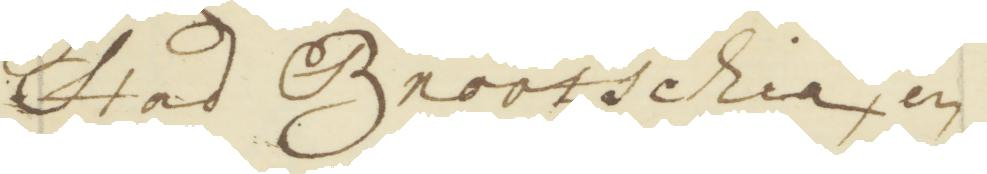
stad Brootschia, en
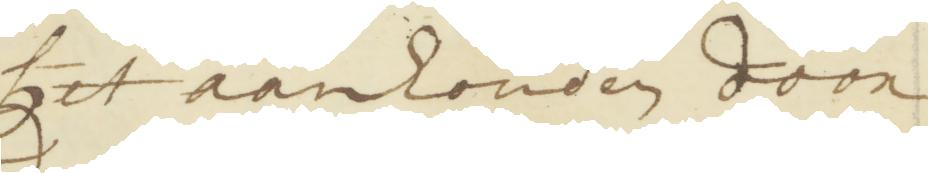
het aanhouden door
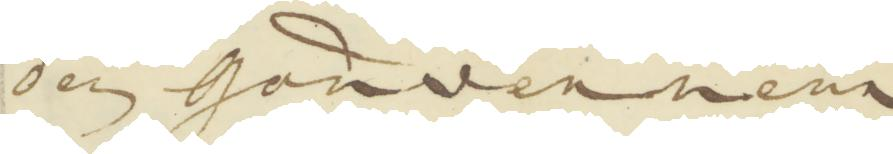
den Gouverneur
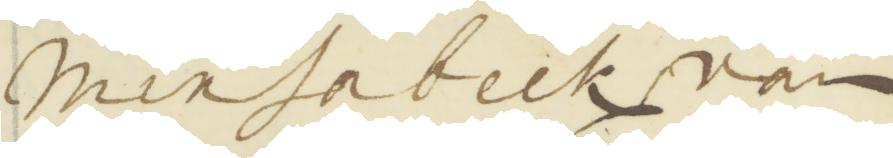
Mirsabeek van
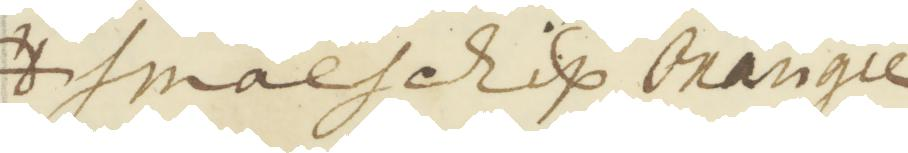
’t smalschip Orangie
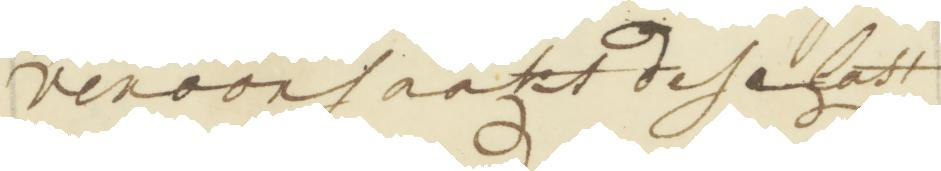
veroorsaakt dese last
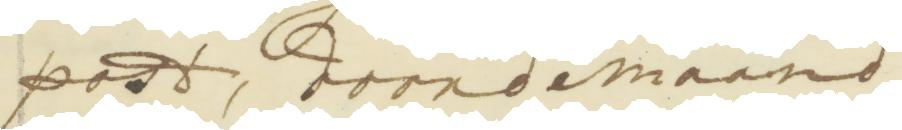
post, doordemaand
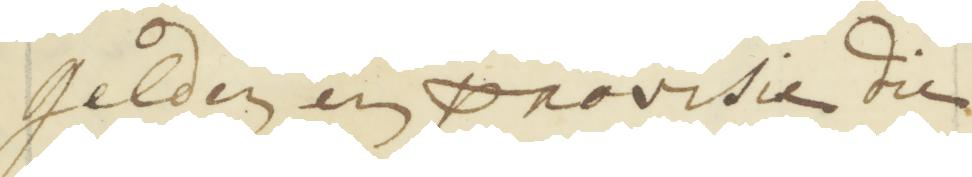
Gelden en provisie die
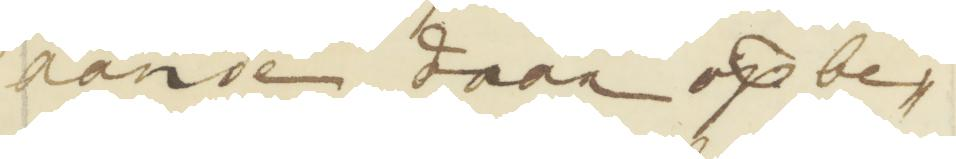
aande daar op be„
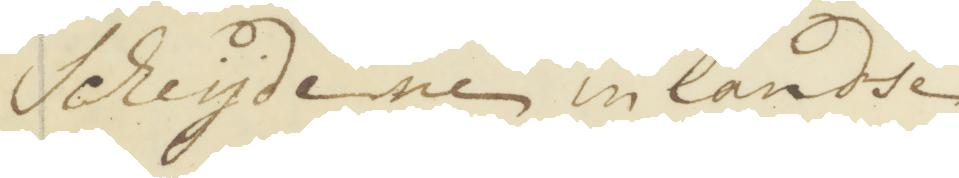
scheijdene inlandse
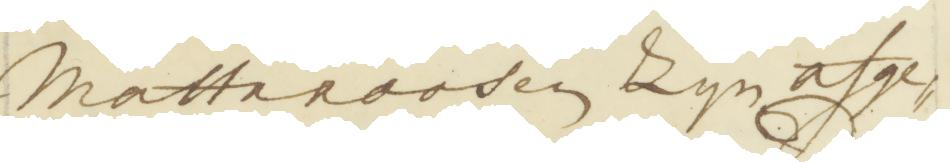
Mattrroosen zijn afge„
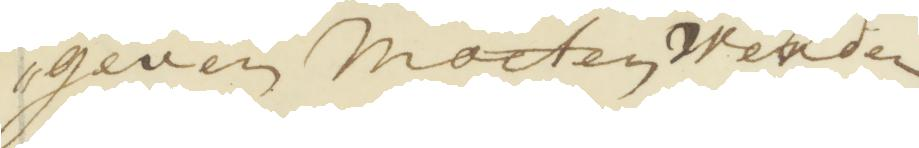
„geven Moeten Werden
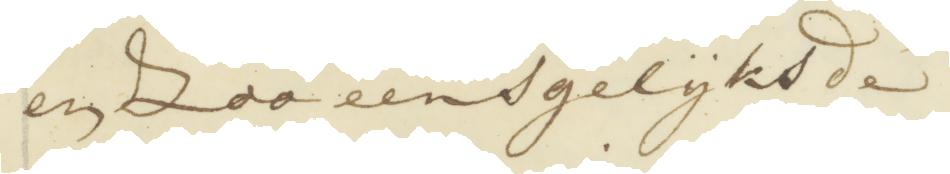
en zoo eensgelijks de
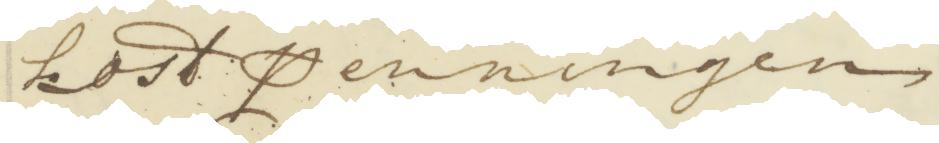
kost penningen
